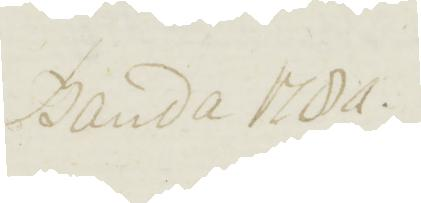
Banda 1784.
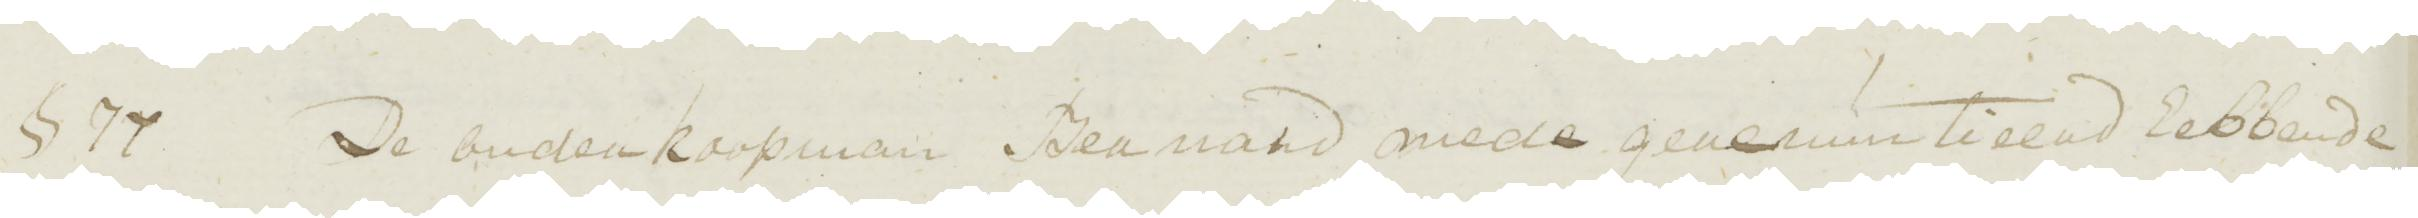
§ 77 De onderkoopman Bernard mede gerenuntieerd hebbende
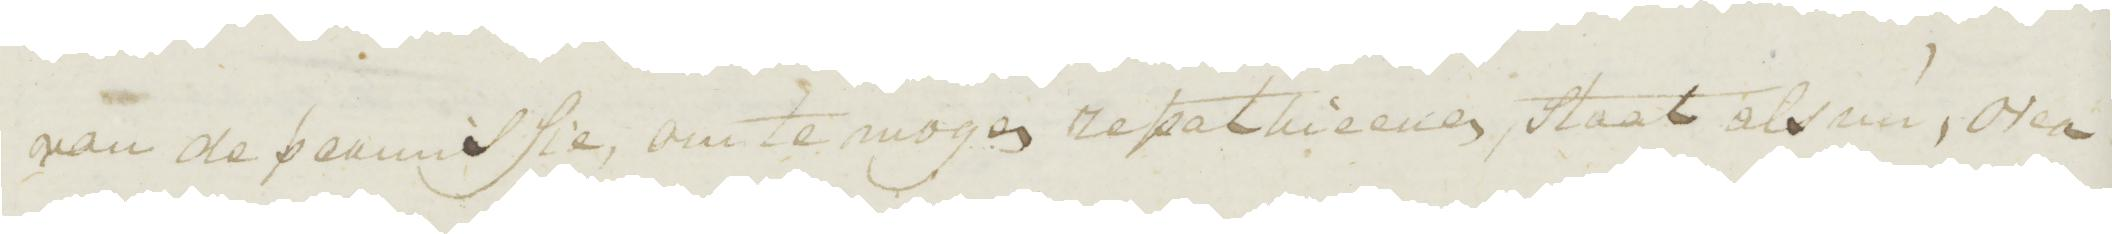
van de permissie, om te mogen repatrieeren, staat als nu, over
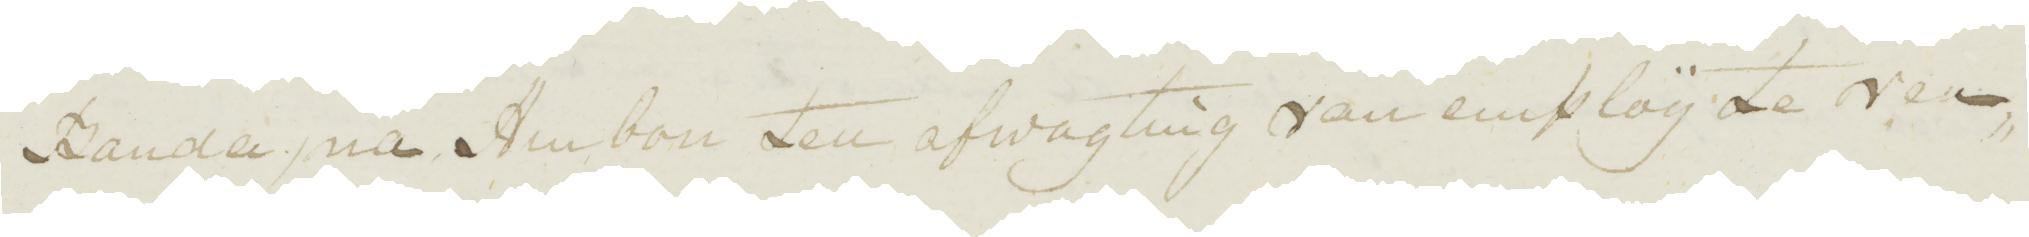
Banda, na, Ambon ten afwagting van emploij te ver„
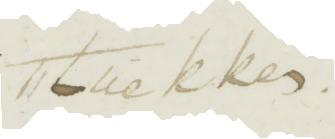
trekken.
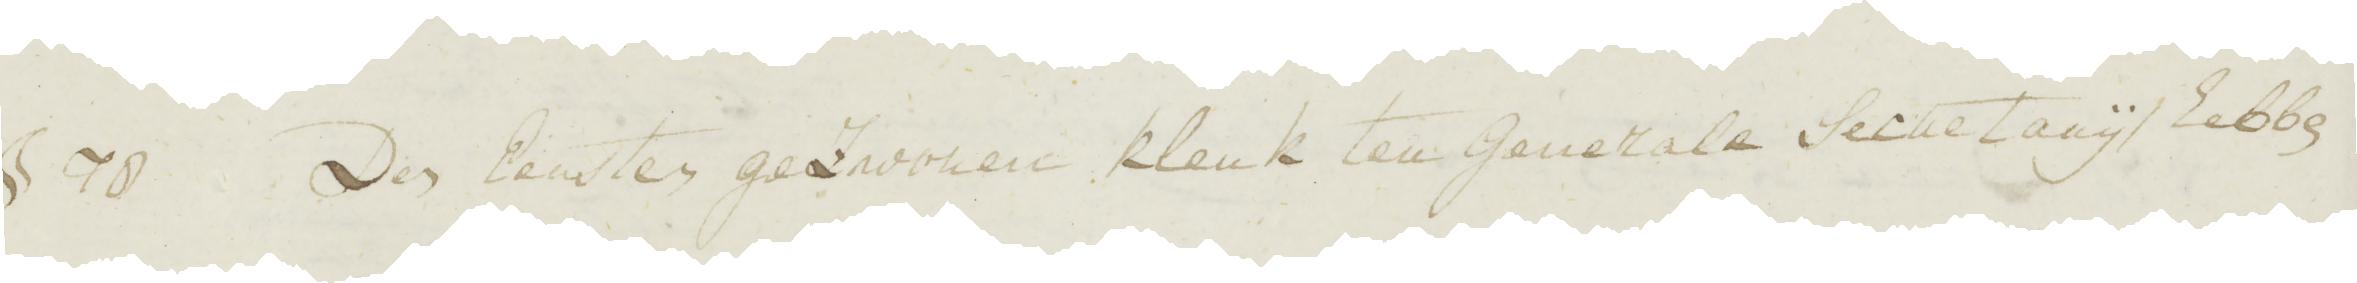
§ 78 Den Eersten gezwooren klerk ten generale secretarij hebben
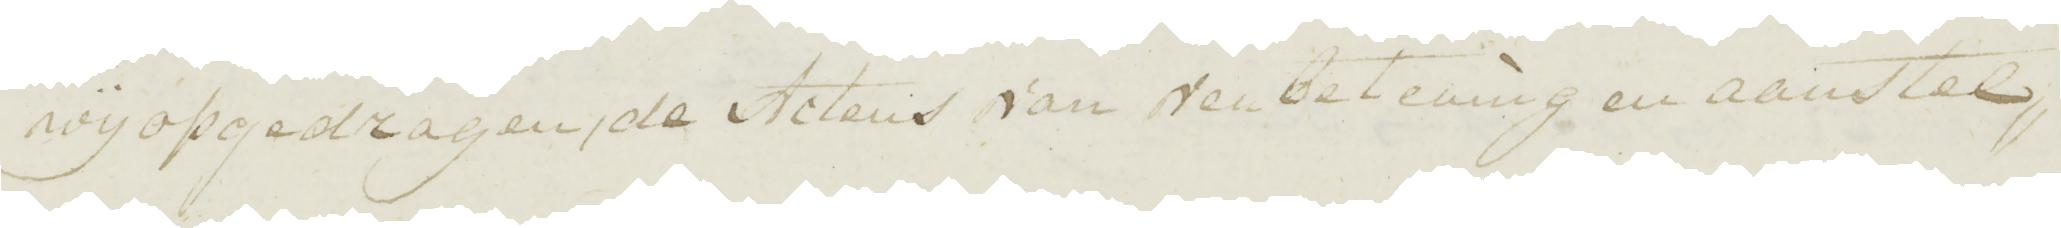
wij opgedragen, de Actens van verbetering en aanstel„
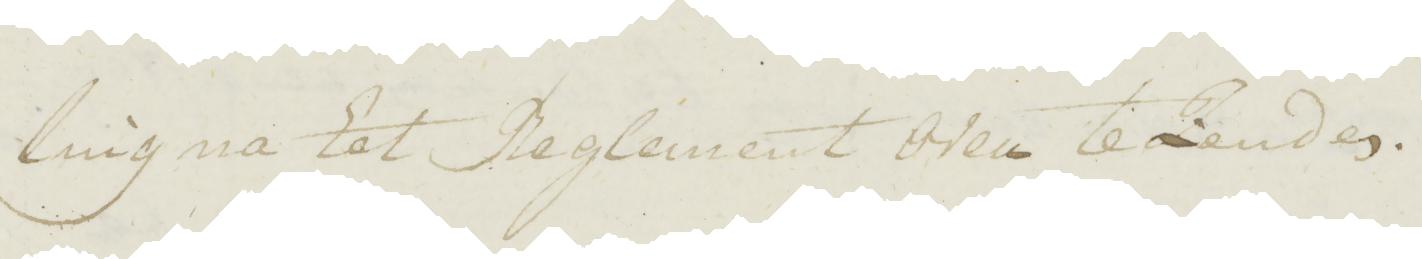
ling na het Reglement over te zenden.
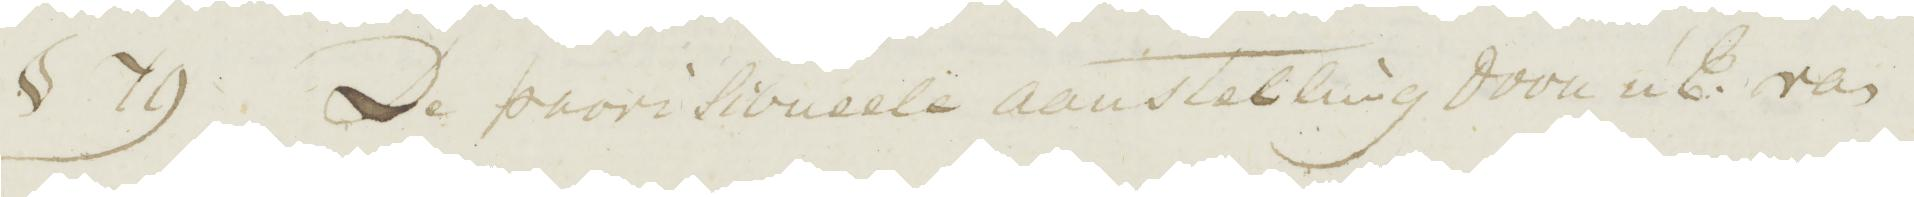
§ 79 De provisioneele aanstelling door uE: van
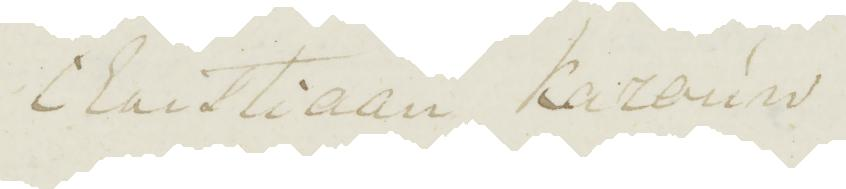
Christiaan Karouw
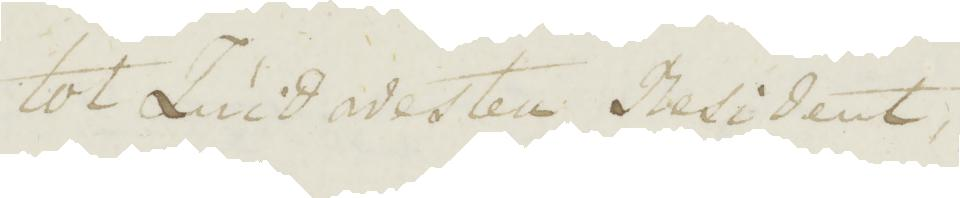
tot Zuid wester Resident,
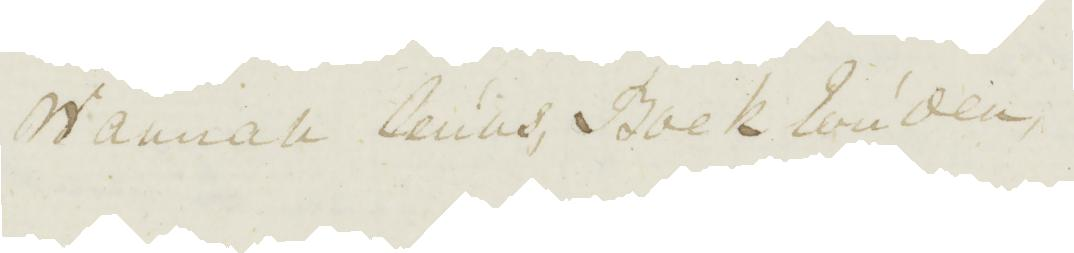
Warnak Oeurs, Boekhouder,
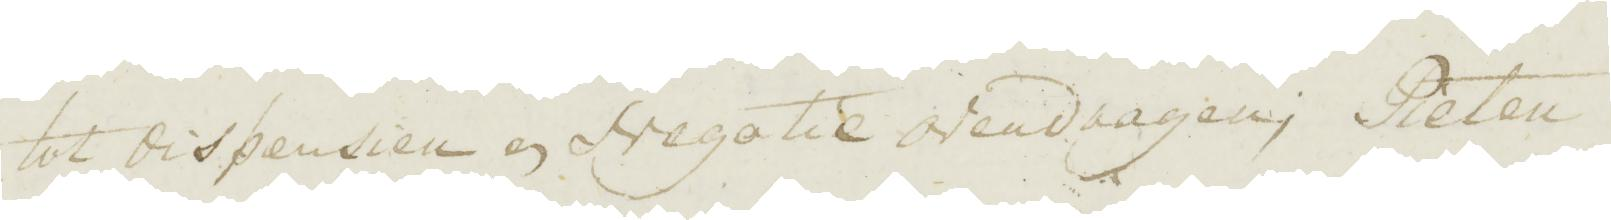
tot dispensien en Negotie overdragen; Pieter
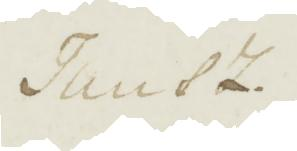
Iansz.
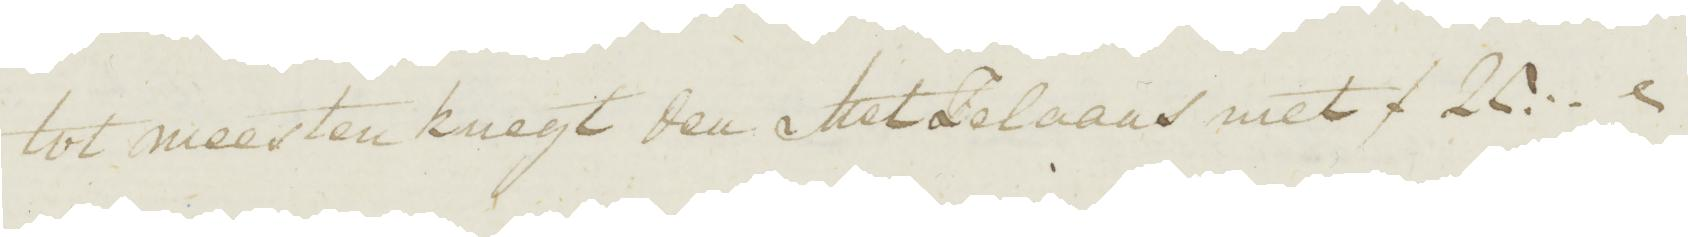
tot meester knegt der Metzelaars met ƒ 25: — en
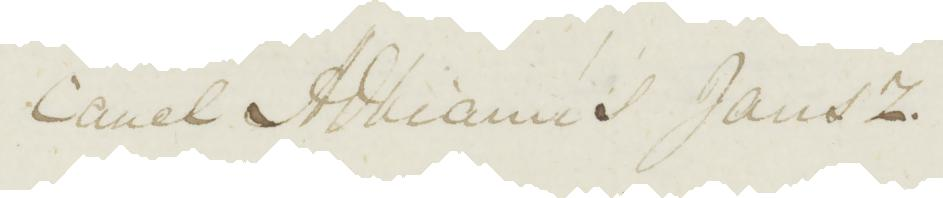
Carel Adrianus Jansz.
